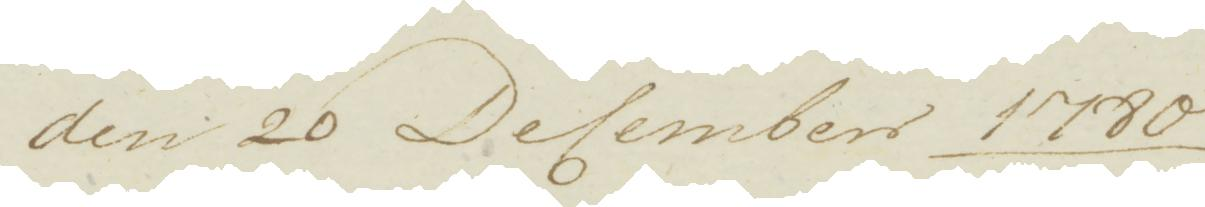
den 20 Decembers 1780
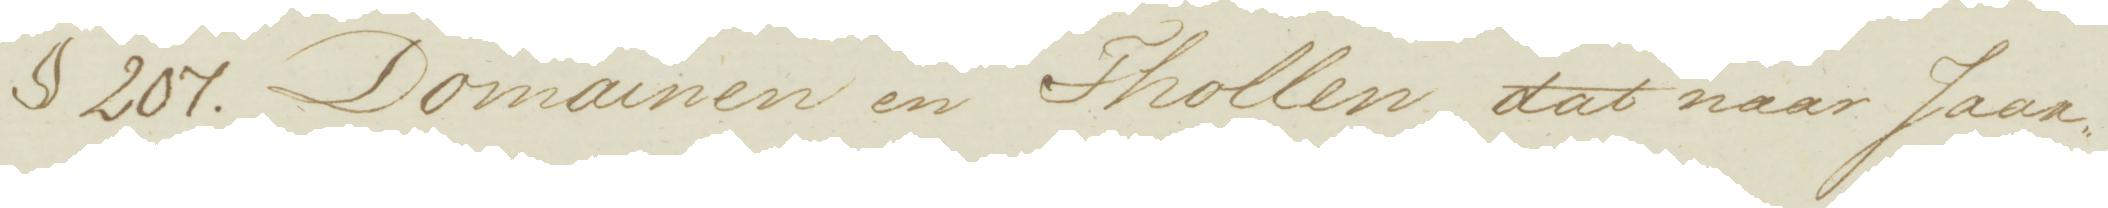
§ 207. Domainen en Thollen dat naar Jaar„
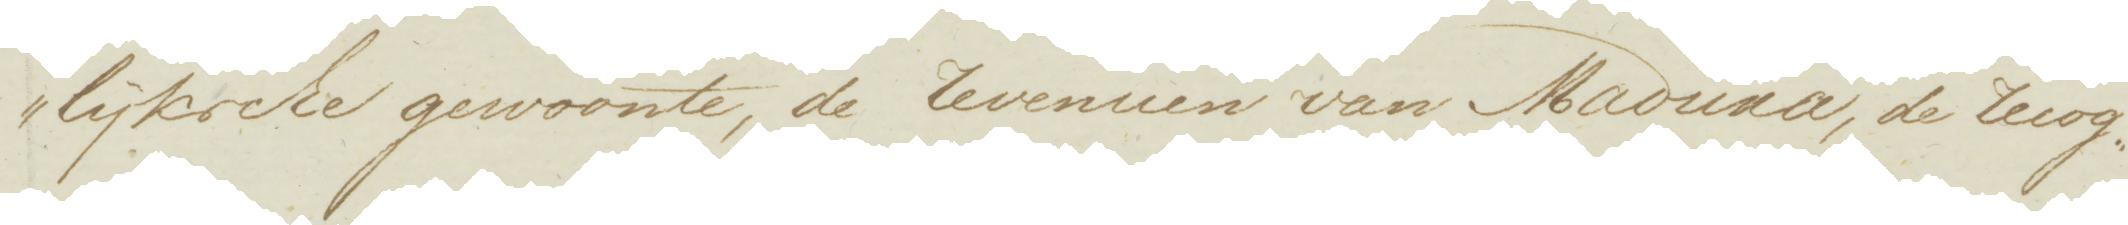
„lijksche gewoonte, de revenuen van Madura, de recog
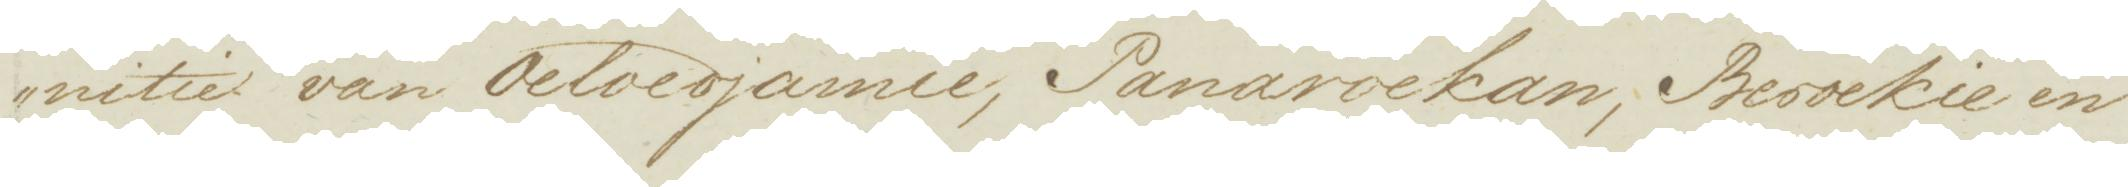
„nitie van Oeloedjamie, Panaroekan, Besoekie en
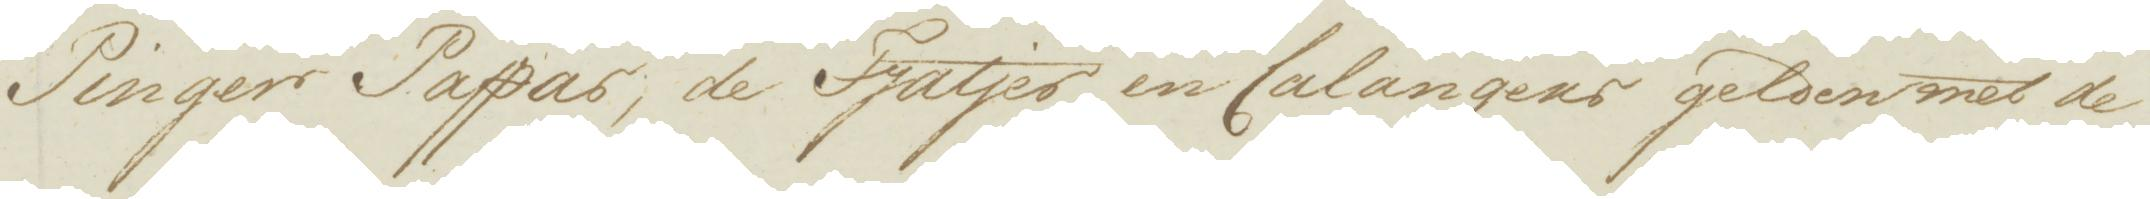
Pinger Pappas, de Tjatjes en Calangers gelden met de
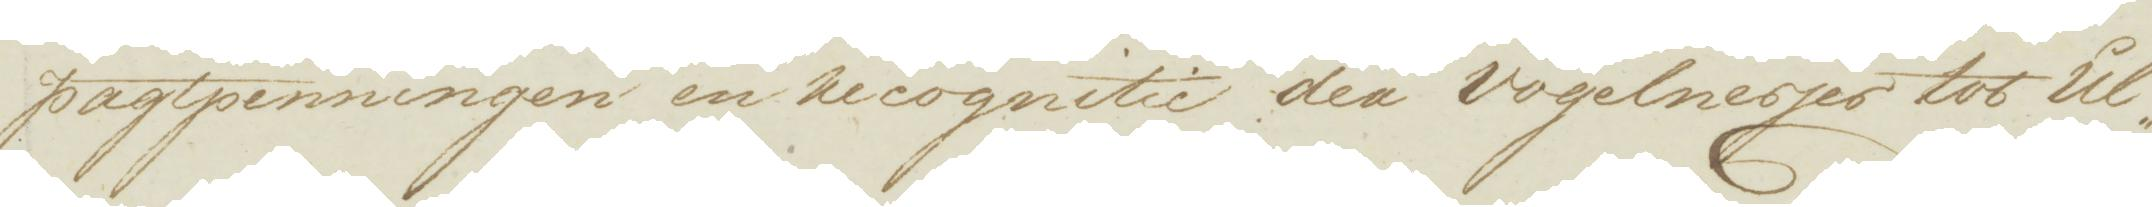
pagtpenningen en recognitie der vogelnesjes tot ul
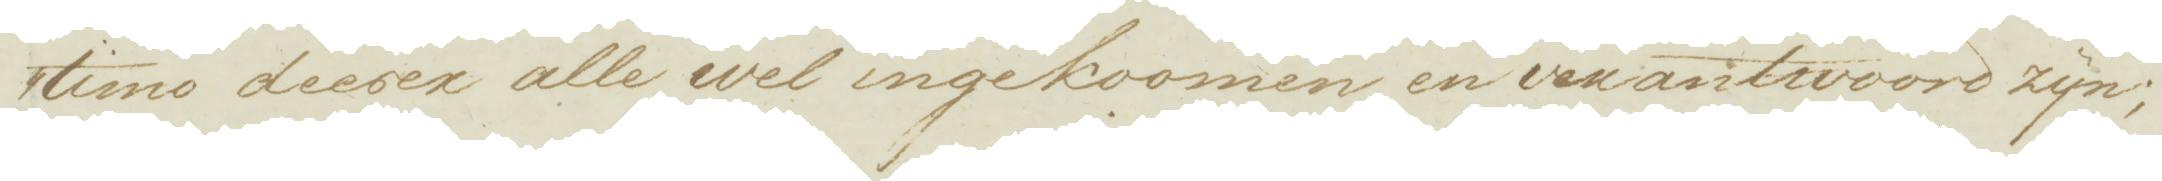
„timo deeser alle wel ingekoomen en verantwoord zijn;
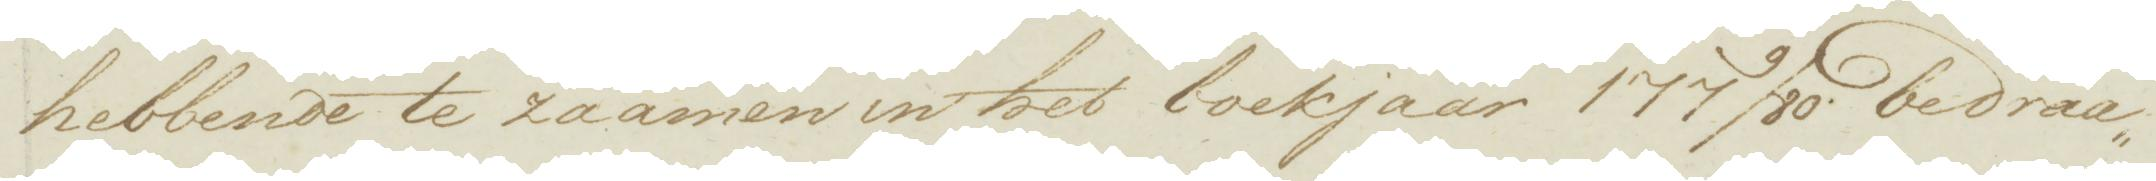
hebbende te zaamen in het boekjaar 1779/80. bedraa„
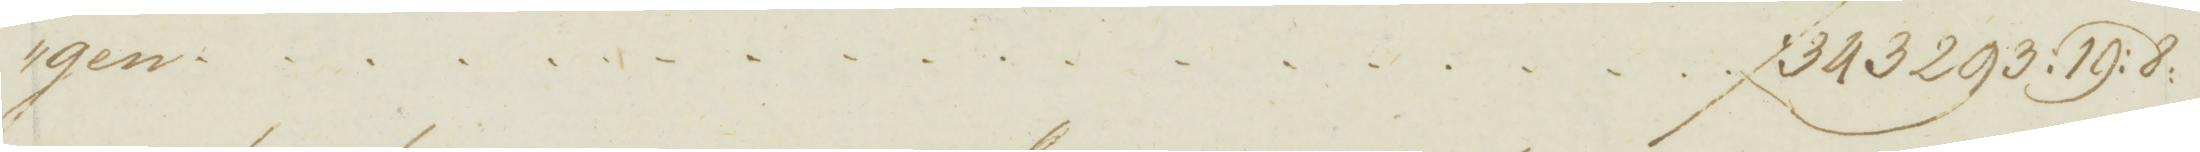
„gen . . . . . . . . . . . . . . . . . . . . ƒ343293: 19: 8:
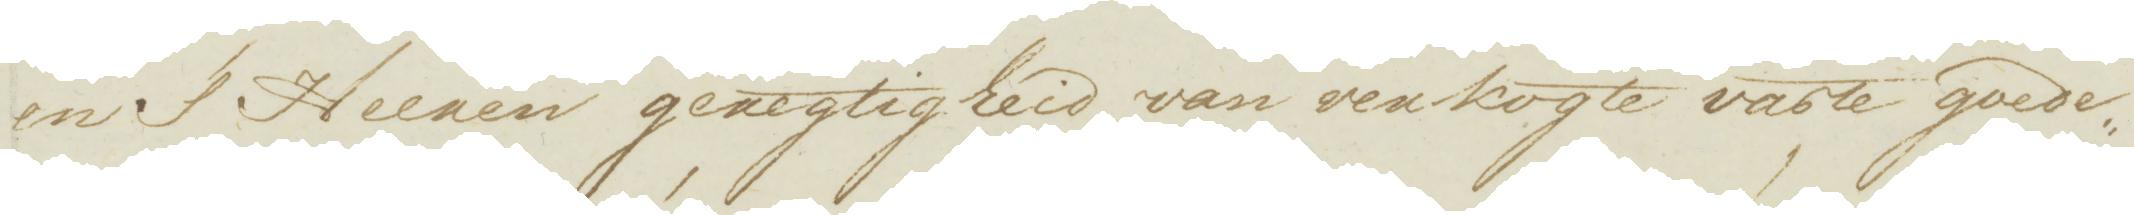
en 's Heeren geregtigheid van verkogte vaste goede„
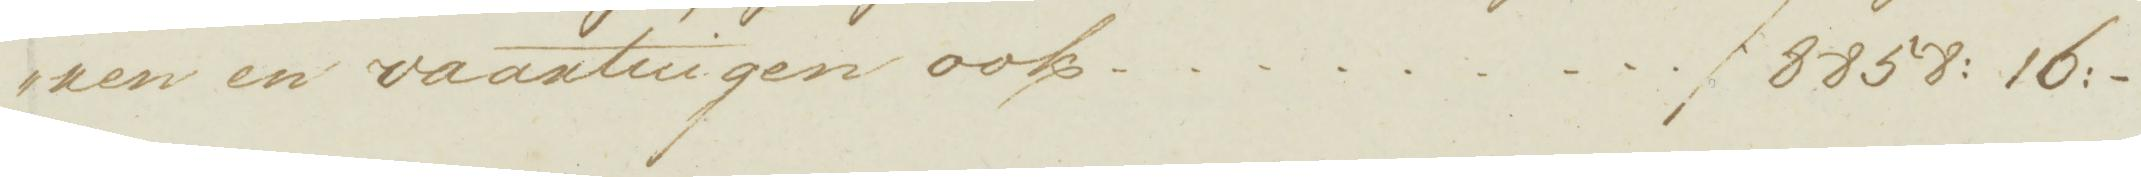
ren en vaartuigen ook . . . . . . . . . ƒ8858: 16: -
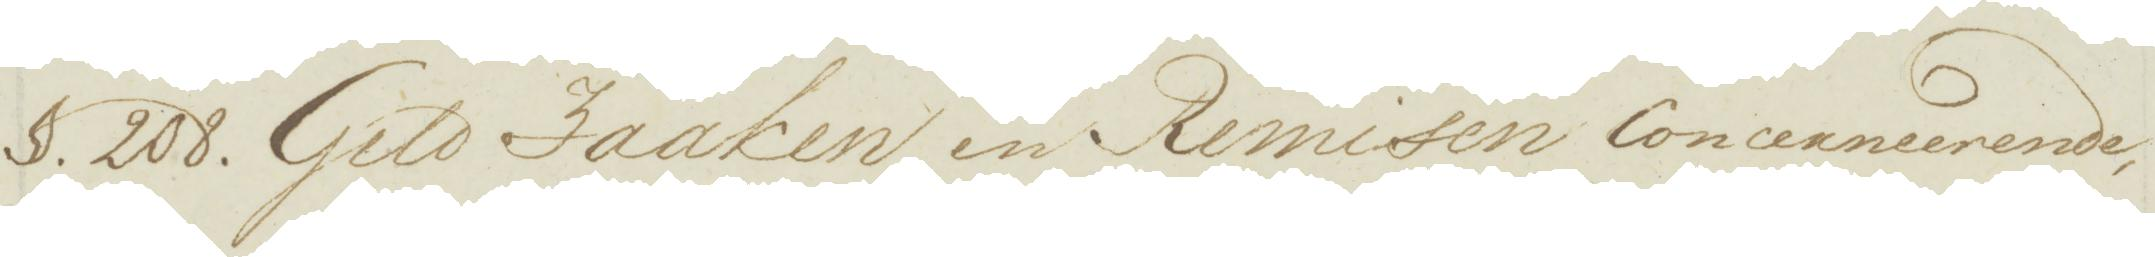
§. 208. Geld Zaaken en Remisen Concerneerende,
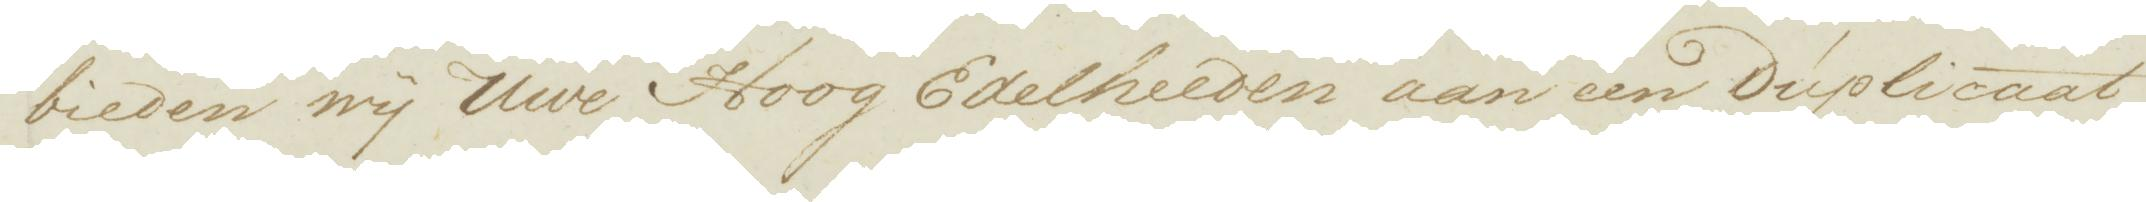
bieden wij Uwe Hoog Edelheeden aan een duplicaat
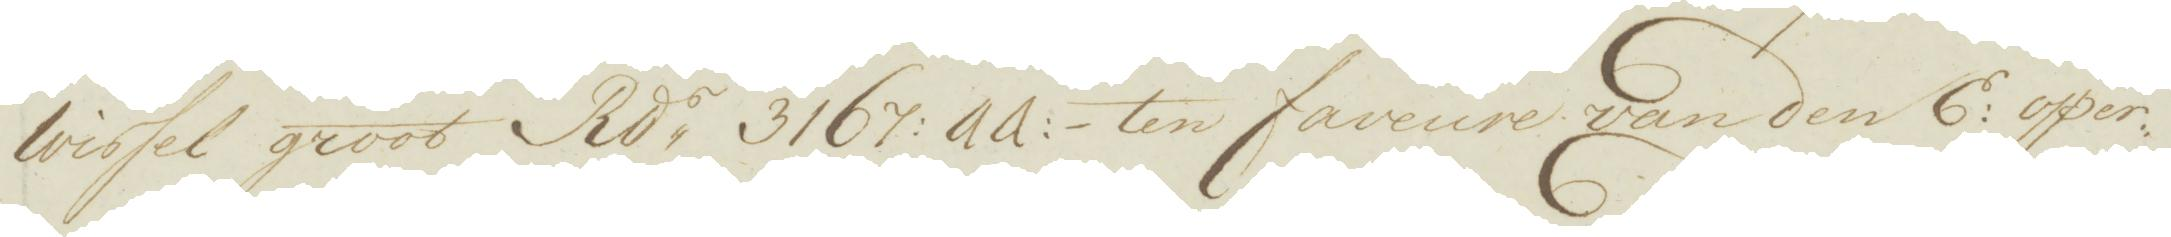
wissel groot Rd„s 3167: 44: - ten faveure van den E: opper„
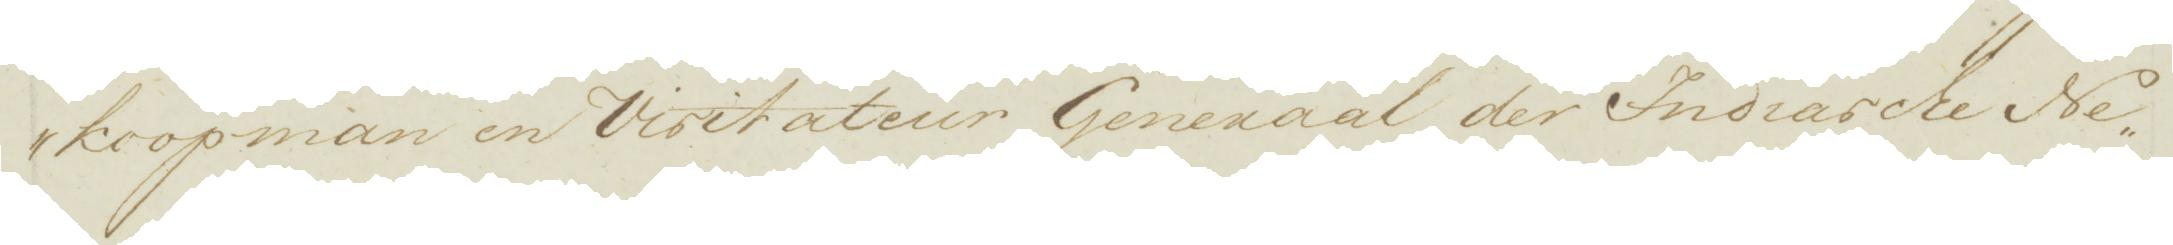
„koopman en Visitateur Generaal der Jndiasche Ne„
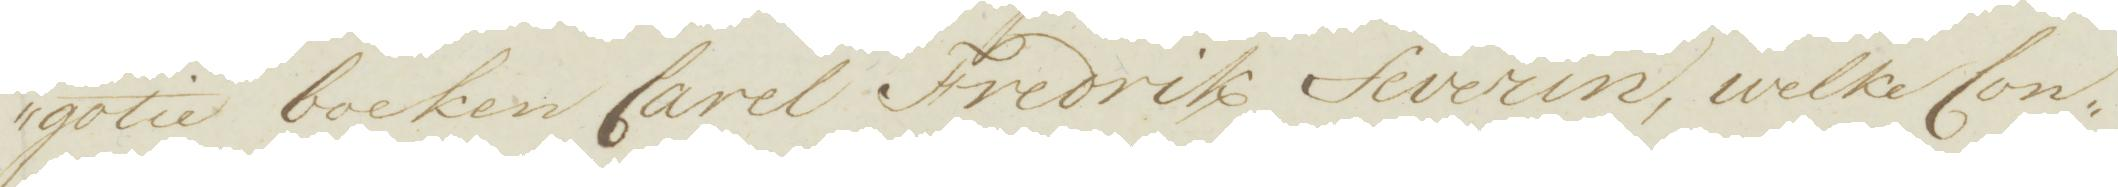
„gotie boeken Carel Fredrik Severin, welke Con„
